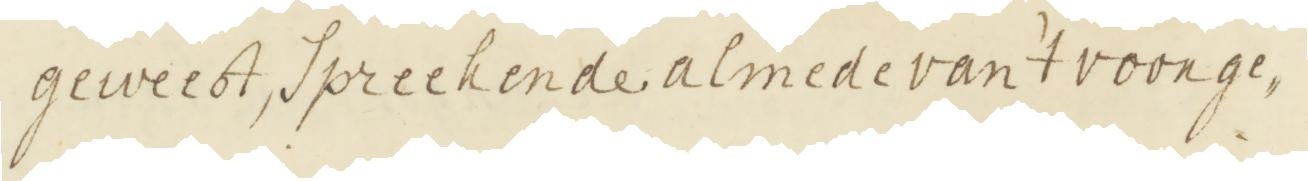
geweest, spreekende almede van ’t voorge„
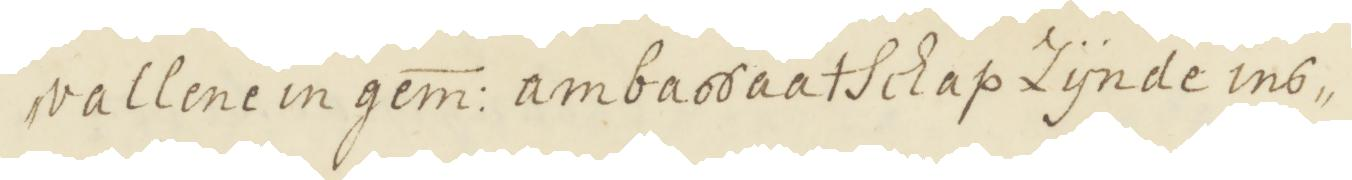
„vallene in gem: ambassaatschap zijnde ins„
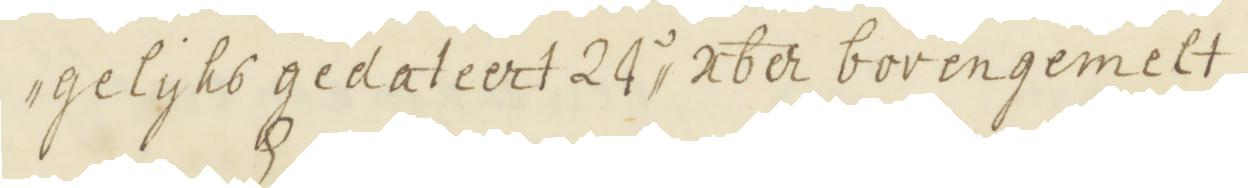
„gelijks gedateert 24„' xber bovengemelt
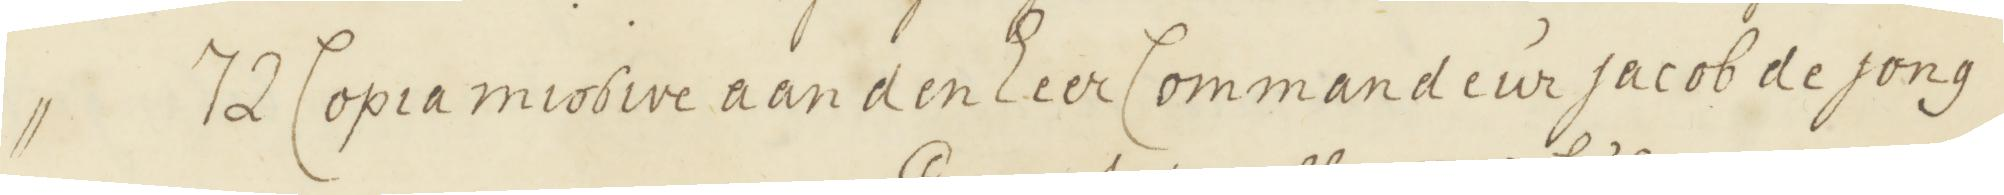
„ 12 Copia missive aan den heer Commandeur jacob de jong
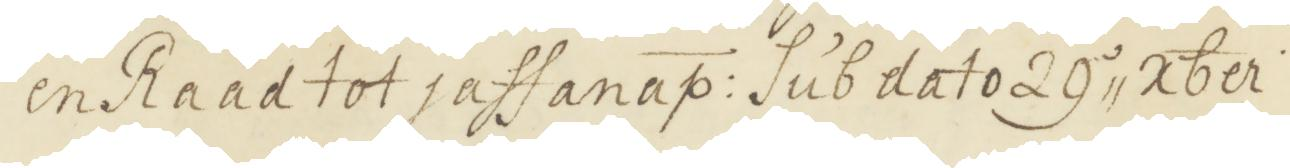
en Raad tot jaffanap: sub dato 29„' xber
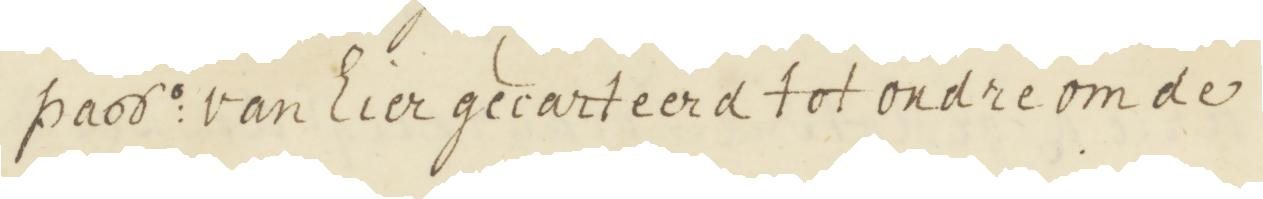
pass:o van hier gecarteerd tot ordre om de
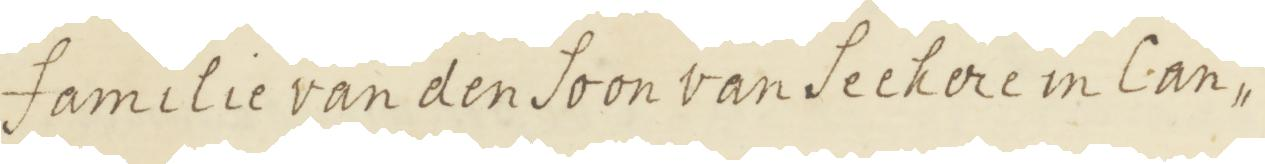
familie van den soon van seekere in Can„
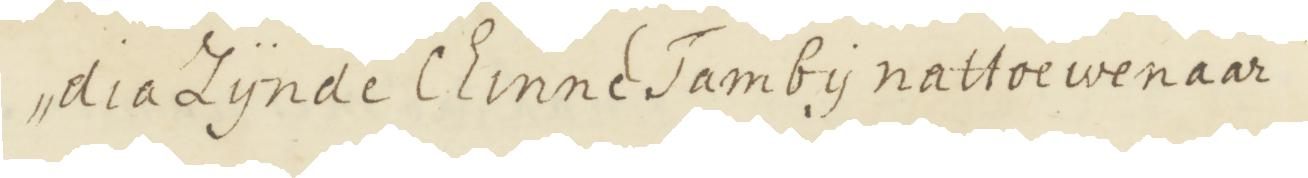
„dia Zijnde Chinne Tambij nattoewenaar
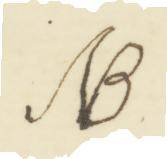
NB
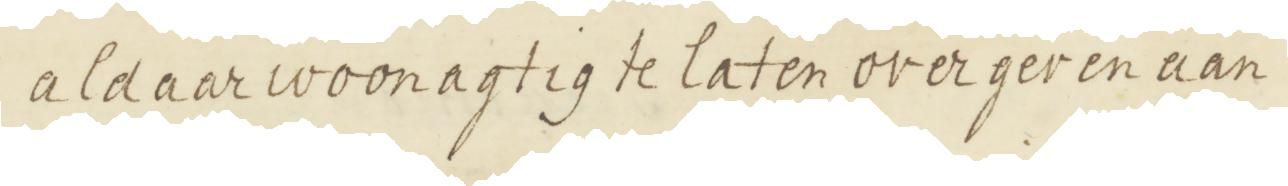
aldaar woonagtig te laten overgeven aan
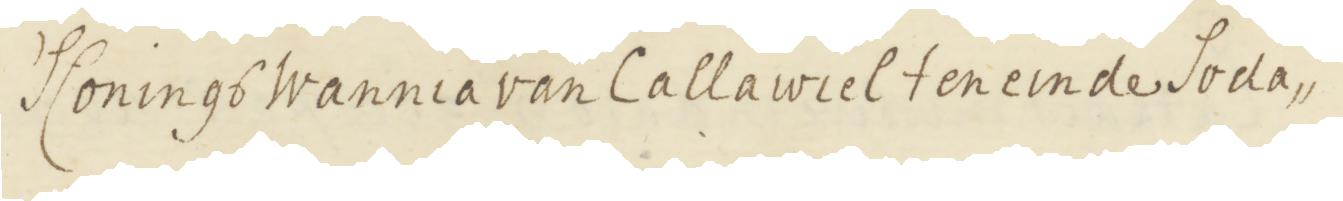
'sConings Wannia van Callawiel ten einde Soda„
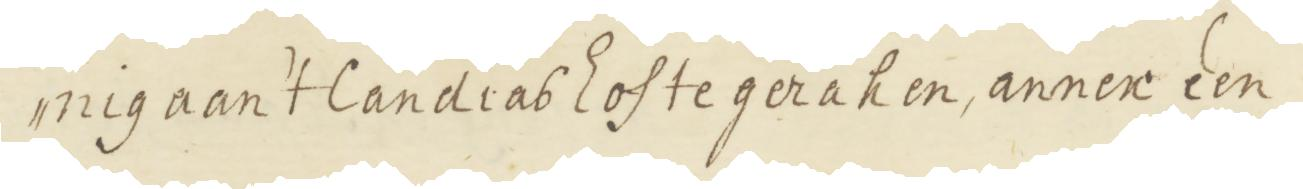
„nig aan ’t Candias hof te geraken, annex een
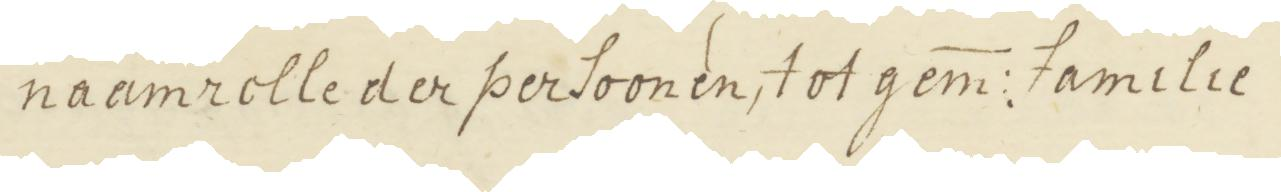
naamrolle der persoonen, tot gem: familie
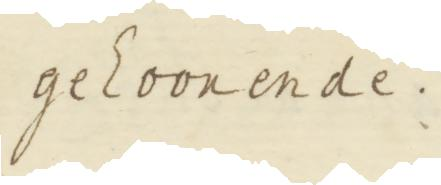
gehoorende.
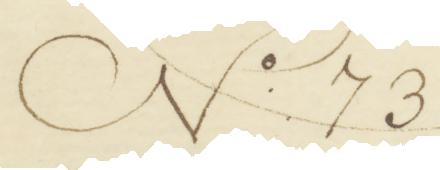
N:o 73
